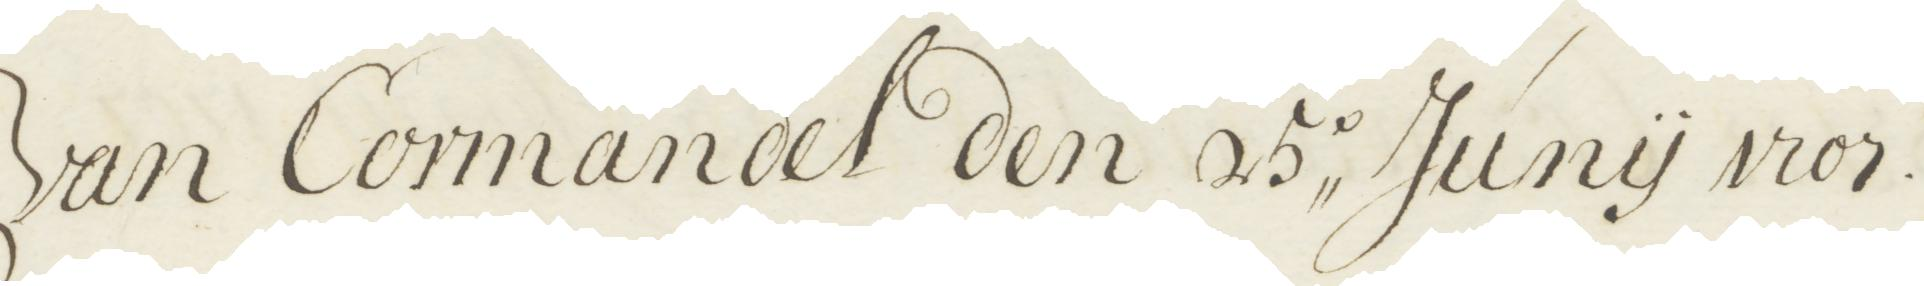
Van Cormandel den 25„e Junij 1707.
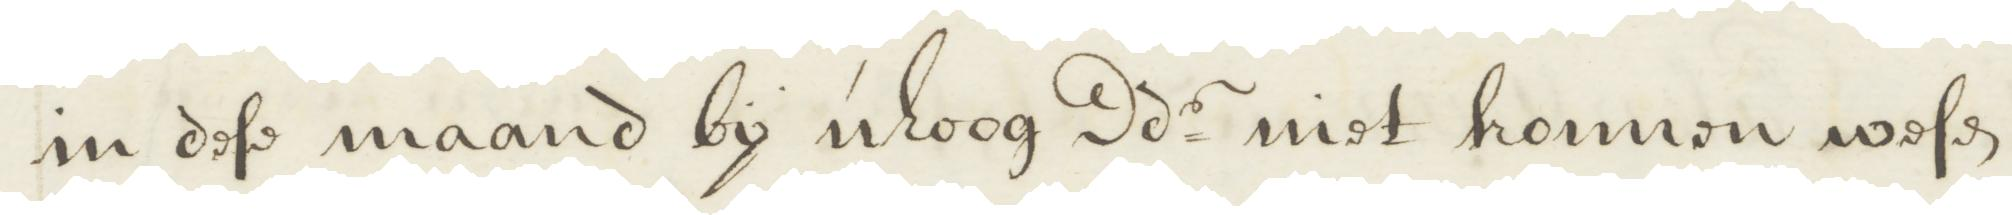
in dese maand bij uhoog Ed=s niet konnen wesen
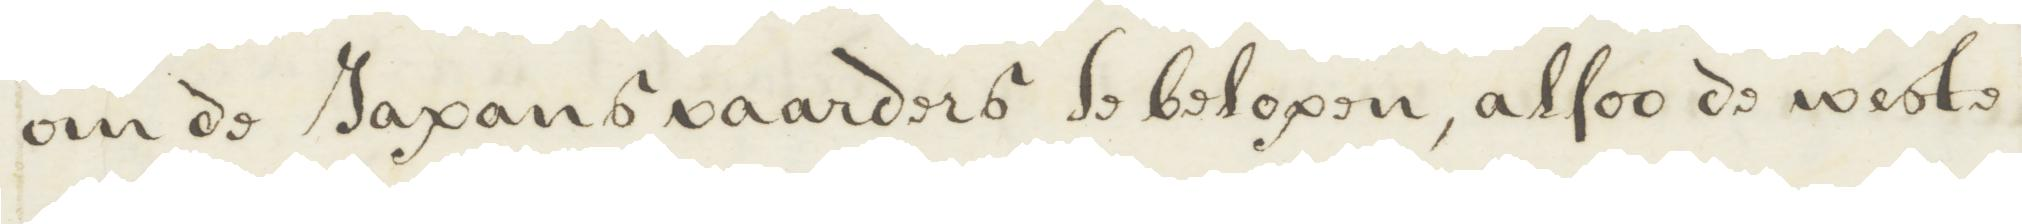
om de Japans vaarders te belopen, alsoo de weste
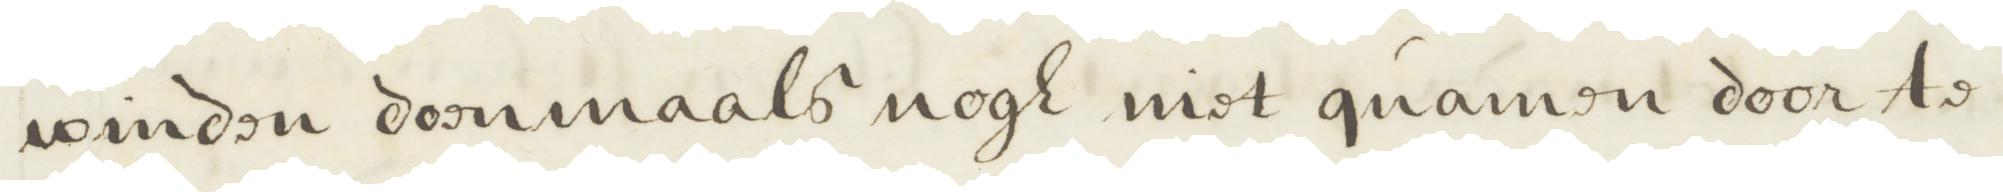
winden doenmaals nogh niet quamen door te
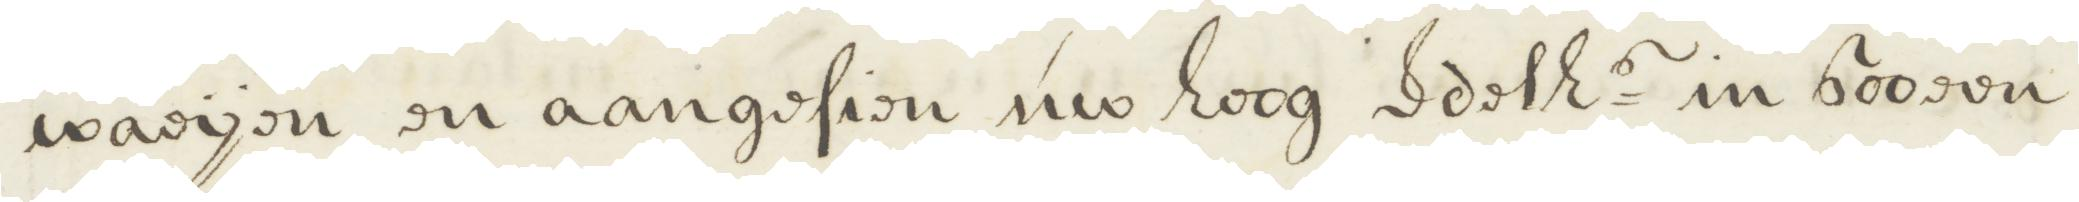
waeijen en aangesien uw hoog Edelh=s in soo een
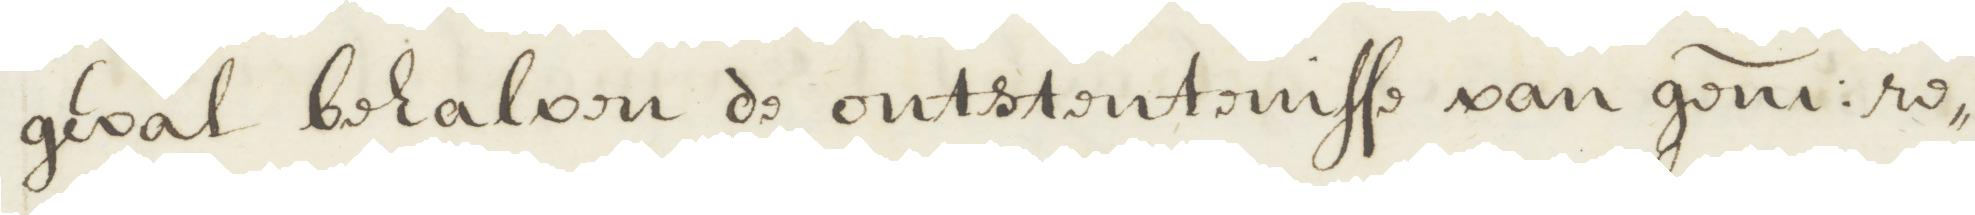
geval behalven de ontstentenisse van gem: re„
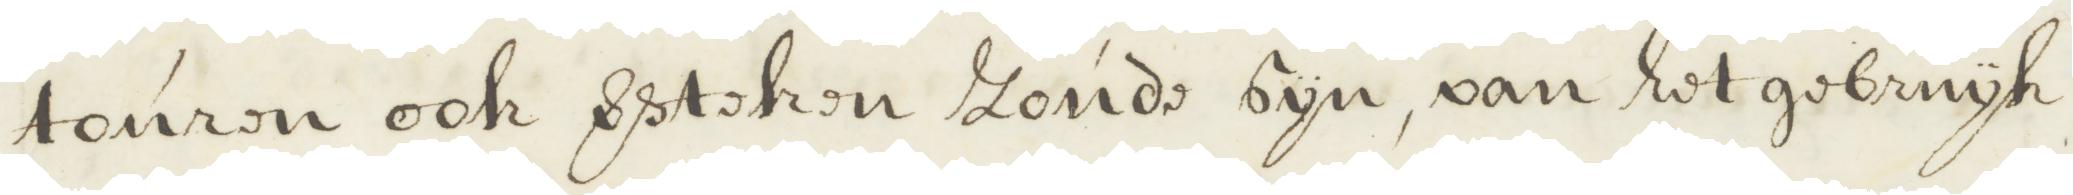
touren ook versteken Zoude sijn, van het gebruijk
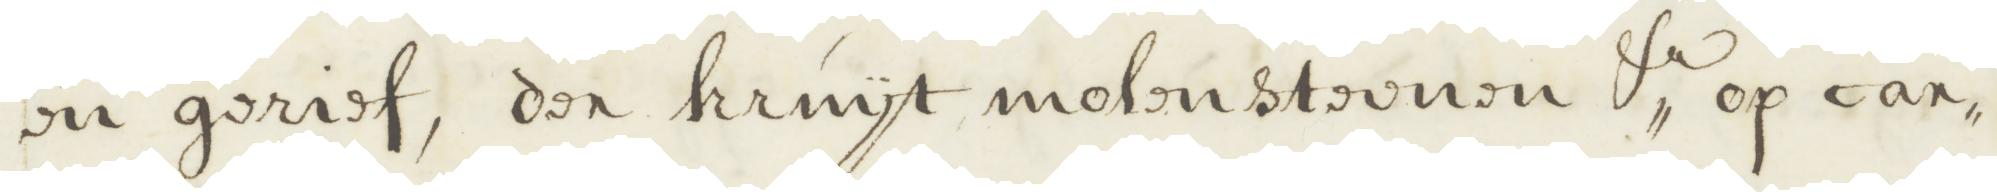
en gerief, der kruijt molensteenen &„a op car„
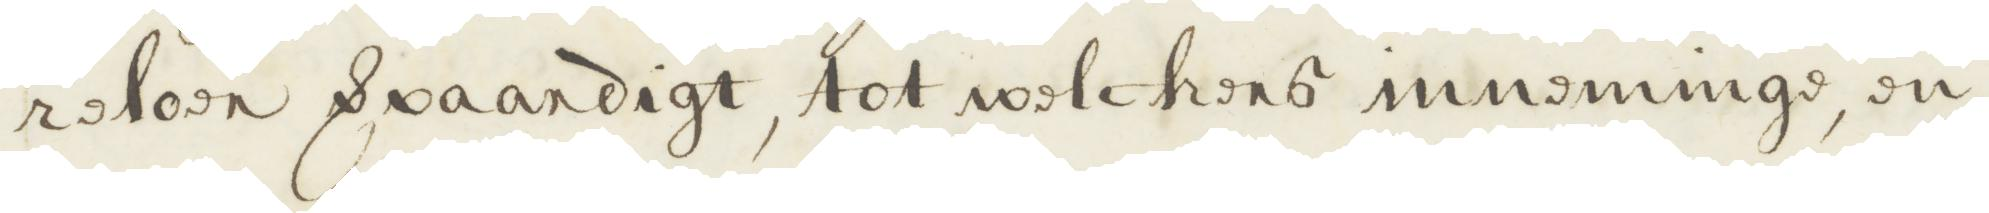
reloer vervaardigt, tot welckers inneminge, en
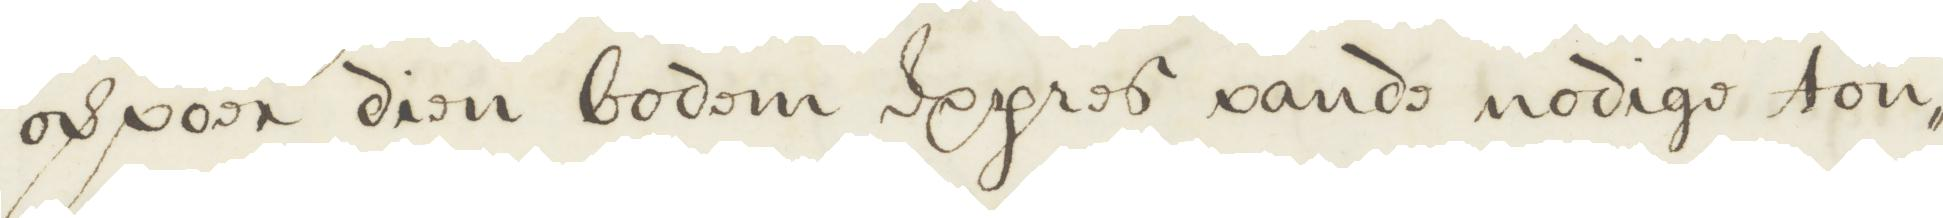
overvoer dien bodem expres van de nodige tou
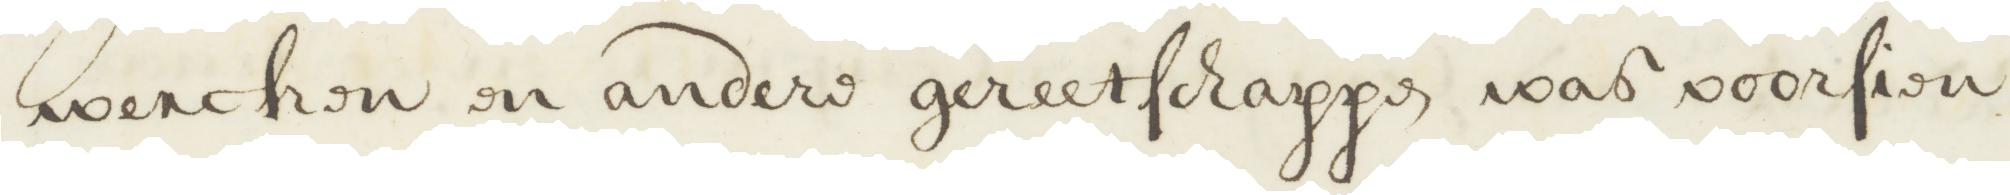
wercken en andere gereetschappen was voorsien
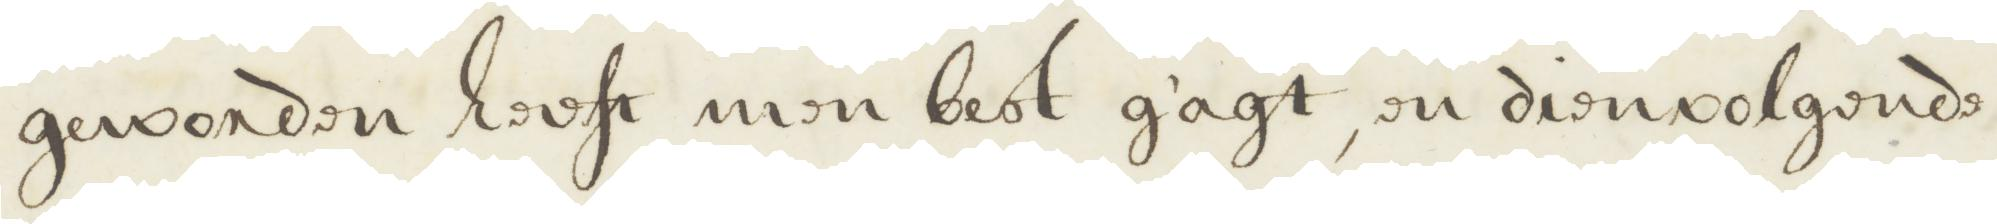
geworden heeft men best g'agt, en dien volgende
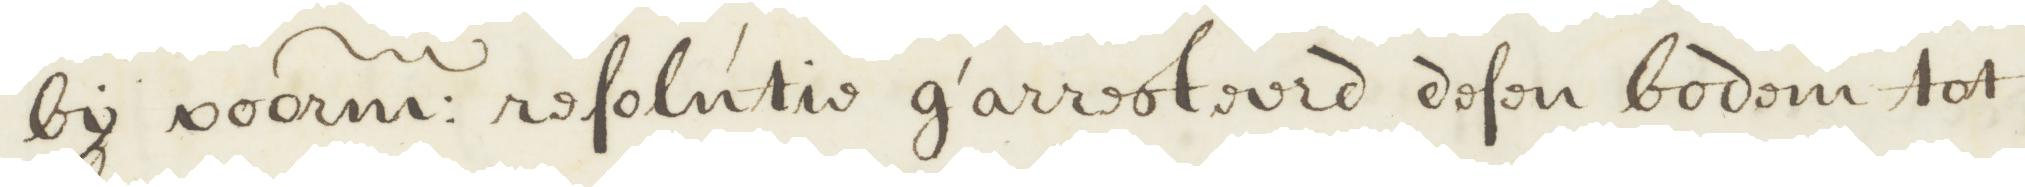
bij voorm: resolutie g’arresteerd desen bodem tot
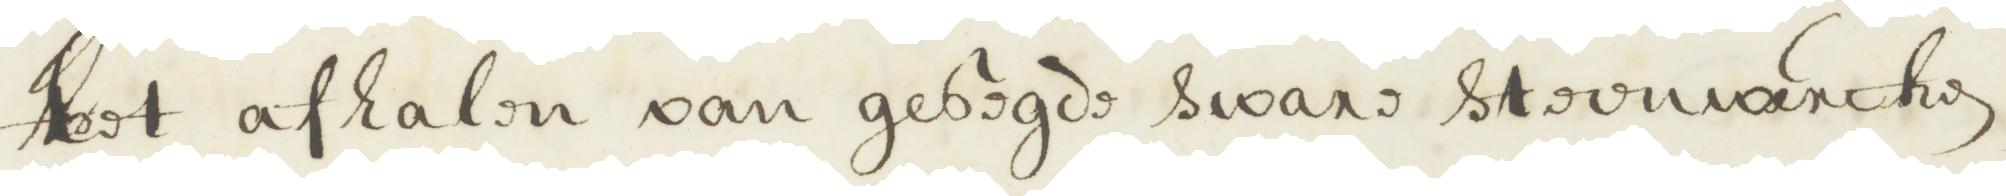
het afhalen van gesegde sware steenwercken
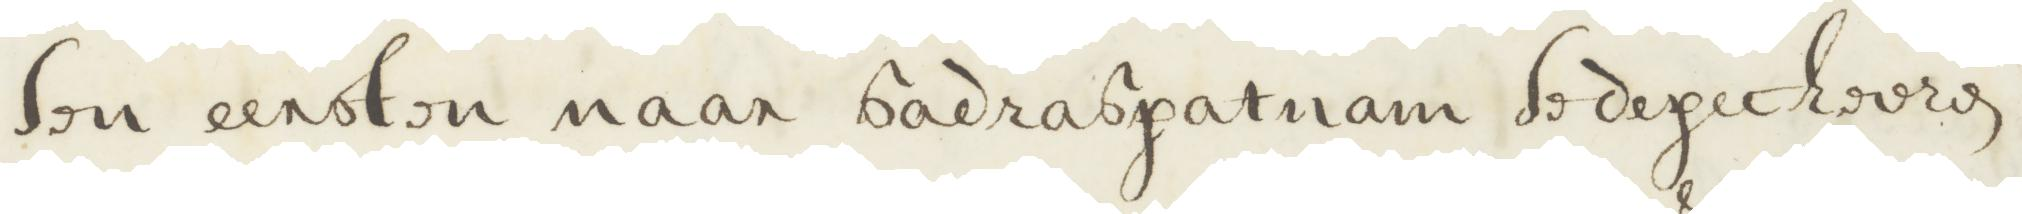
ten eersten naar sadraspatnam te depecheeren
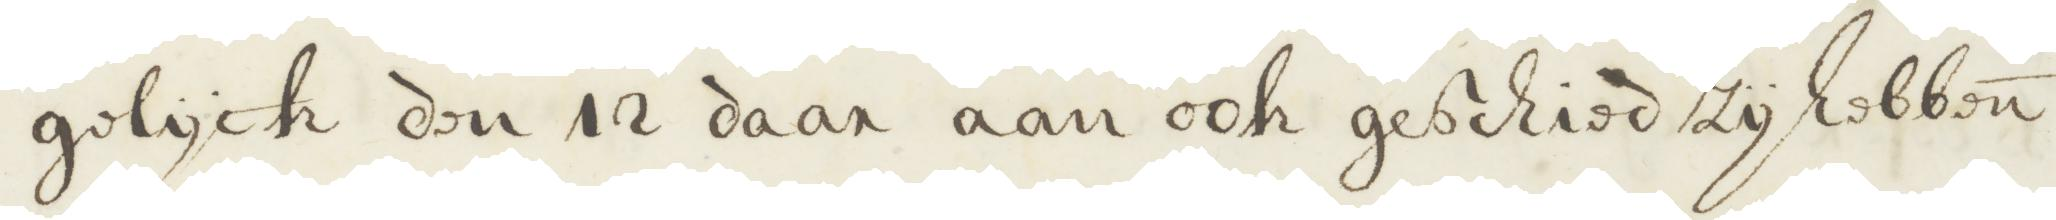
gelijck den 12 daar aan ook geschied Zij hebben
